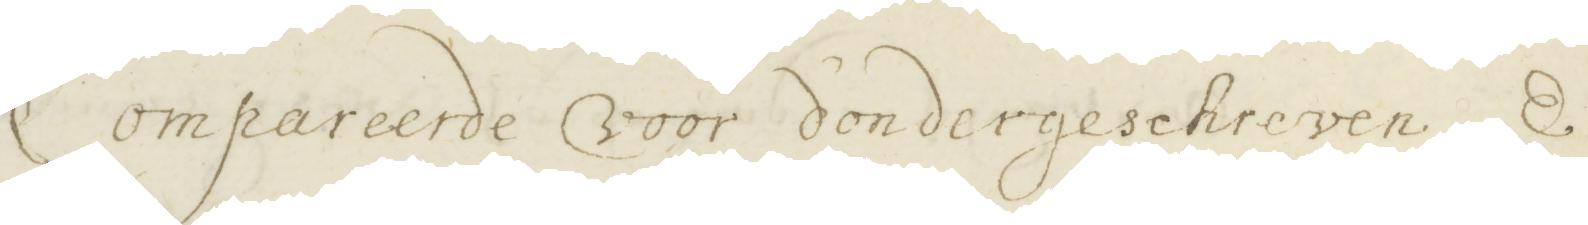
Compareerde voor d'ondergeschreven E.
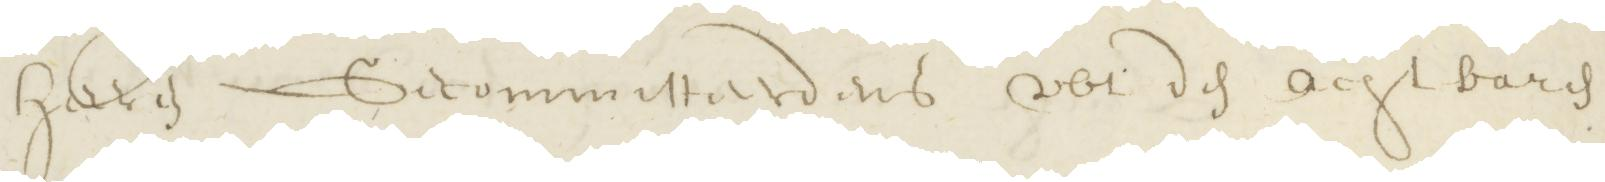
heeren Gecommitteerdens wt den achtbaren
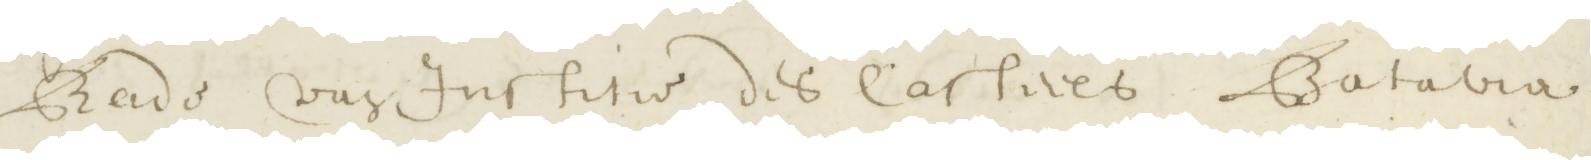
Rade van Justitie des Casteels Batavia
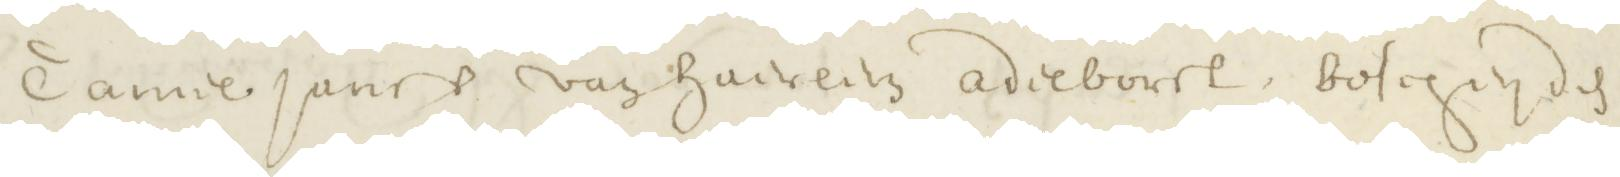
Damel jansz van haerlem adelborst, bescheyden
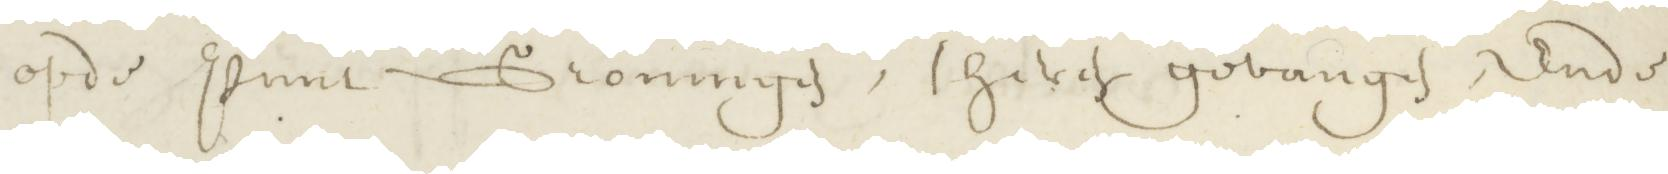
opde punt Groningen, sheres gevangen, ende
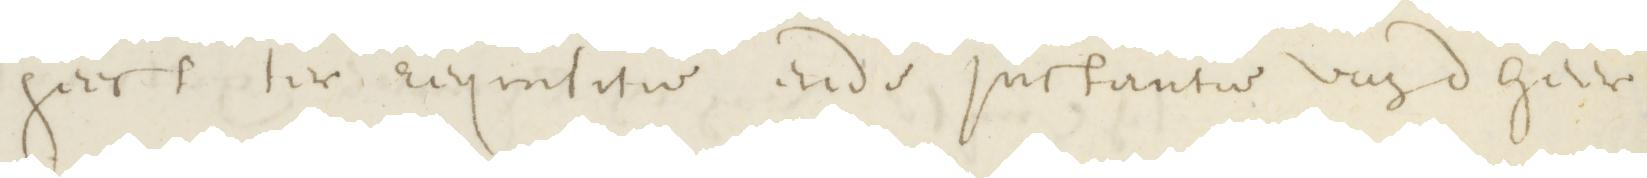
heeft ter requisitie ende Instantie van d heer
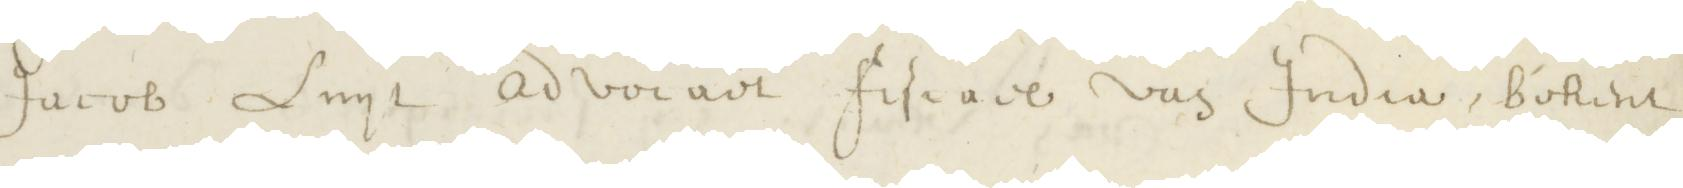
Jacob Luyt advocaet fiscael van Jndia, bekent
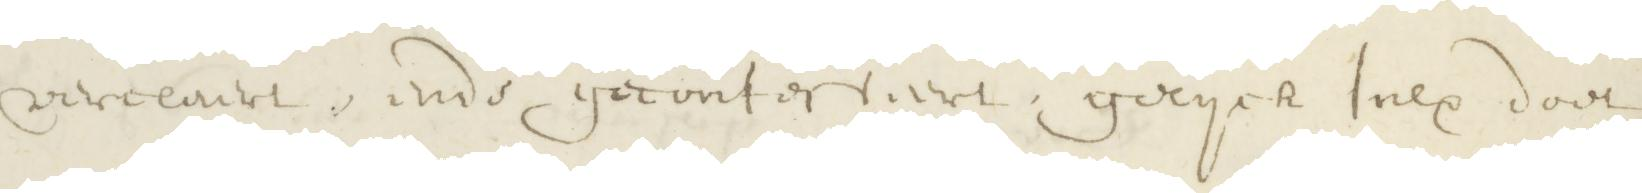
verclaert, ende geconfesteert, gelijck sulx doet
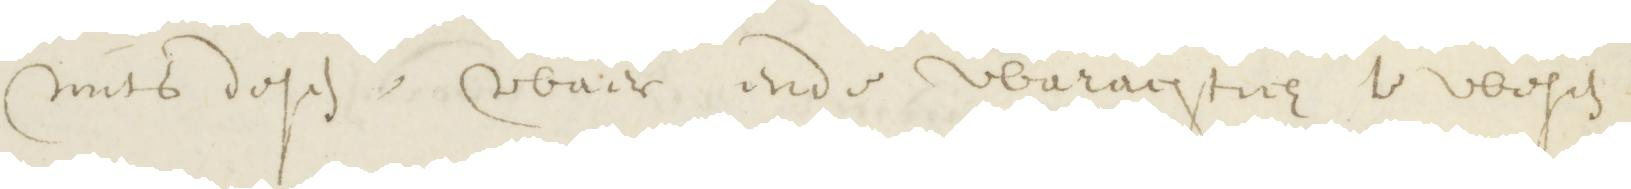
mits desen, waer ende waragtich te wesen
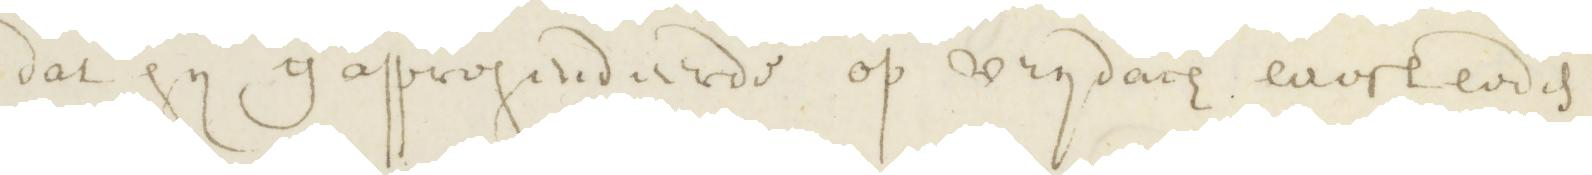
dat hij g'apprehendeerde op vrijdach laestleden
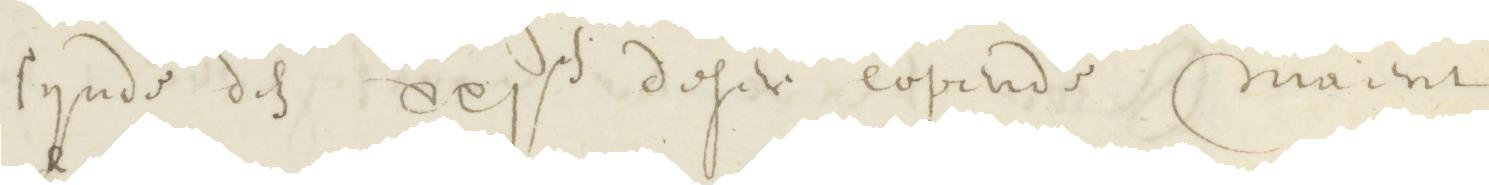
sijnde den eerste deser lopende maent
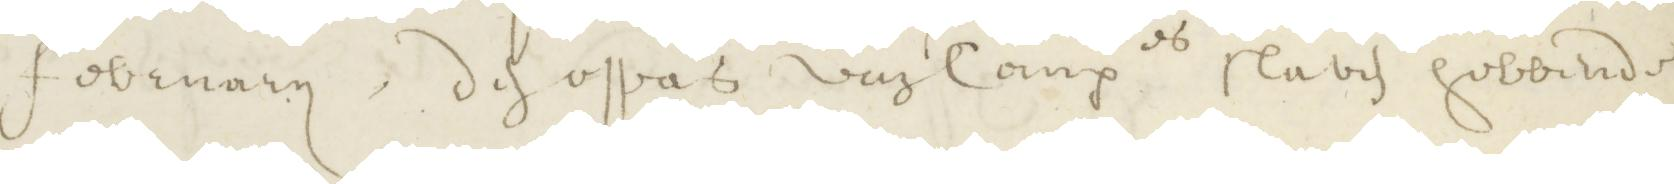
February, den oppas van Compes slaven hebbende
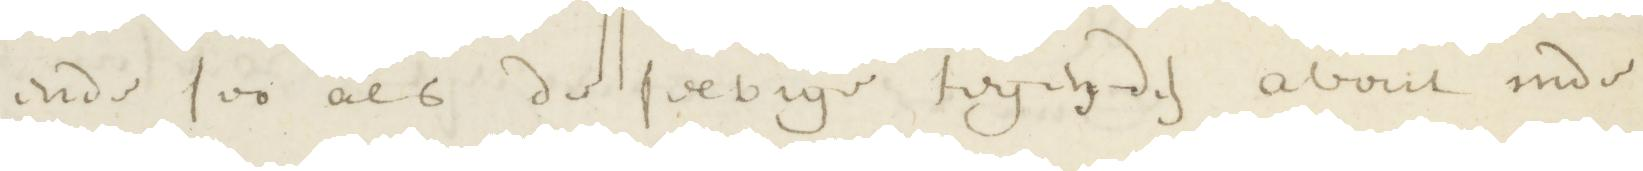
ende soo als de selvige tegenden avont inde
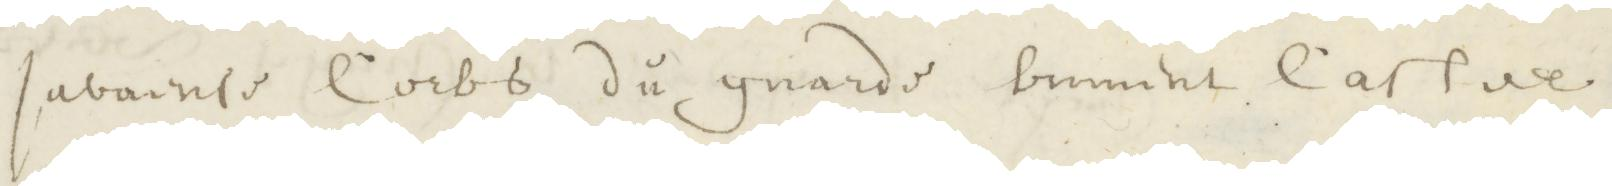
Javaense Corbs du guarde binnent Casteel
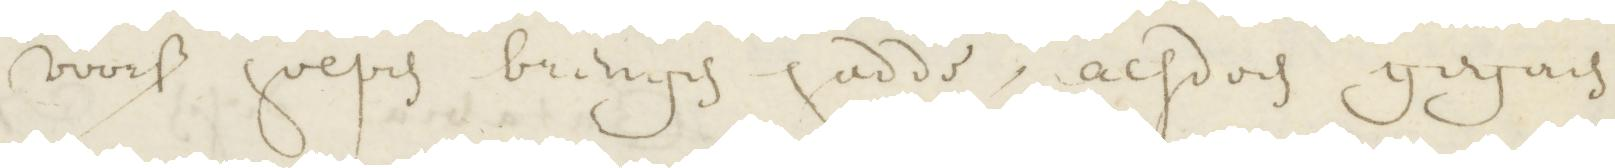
voorsz helpen brengen hadde, alsdoen gegaen
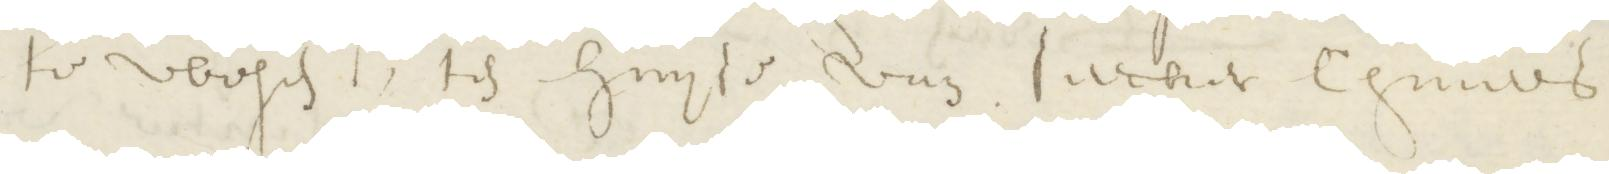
te wesen, ten huyse van seecker Chinees
